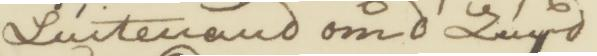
Luitenand om d’zuyd
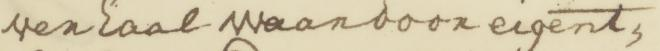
verhaal waardoor eigent„
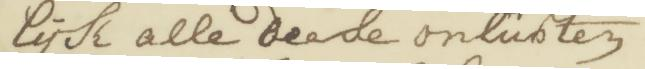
lijk alle deese onlusten
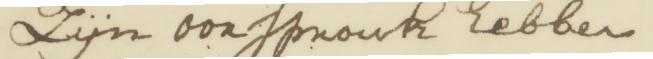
zijn oorspronk hebben
